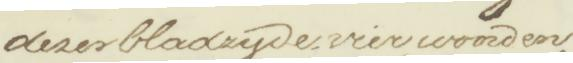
dezer bladzyde, vier woorden,
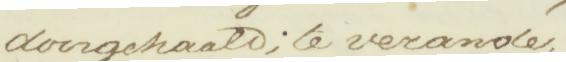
doorgehaald; te verande.
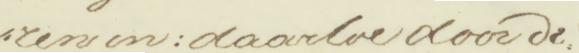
„ren in: daartoe door de,
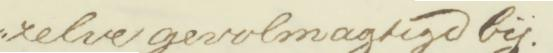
„zelve gevolmagtigd bij.
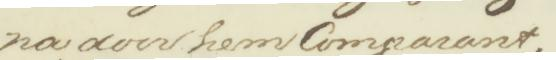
na door hem Comparant,
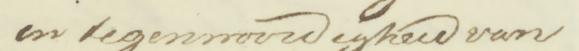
in tegenwoordigheid van
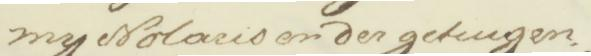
my Notaris en der getuigen,
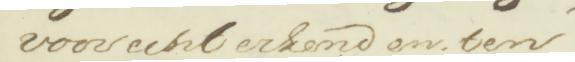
voor echt erkend en, ten
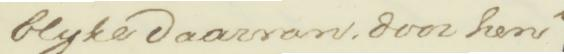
blyke daarvan, door hen
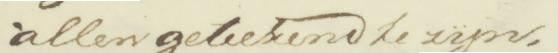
allen geteekend te zijn,
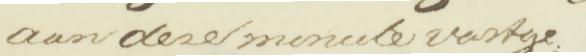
aan deze minute vastge„
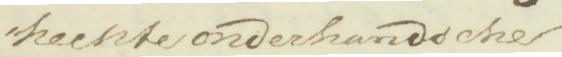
„hechte onderhandsche
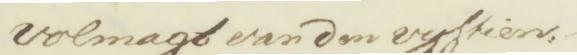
volmagt van den vyftien,
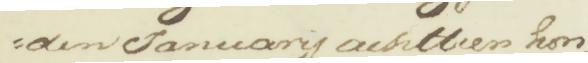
„den Ianuarij achttien hon
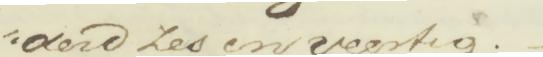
„derd zes en veertig.
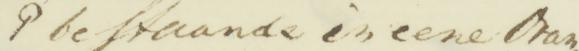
¶ bestaande in eene Oran.
